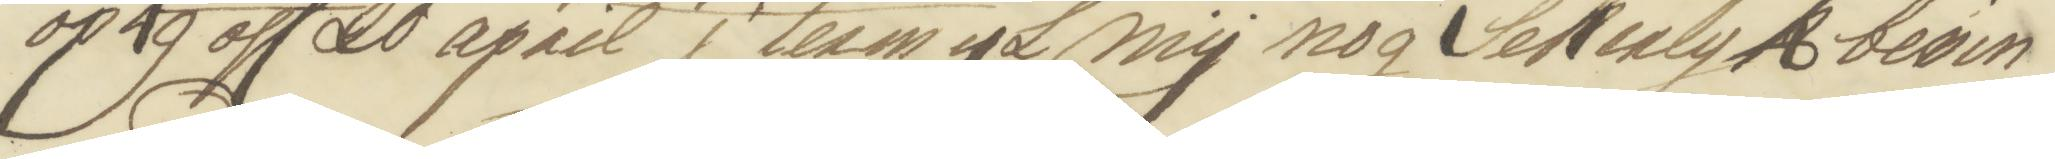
op 19 off 20 april j terwijl wij nog sekerlyk bevin
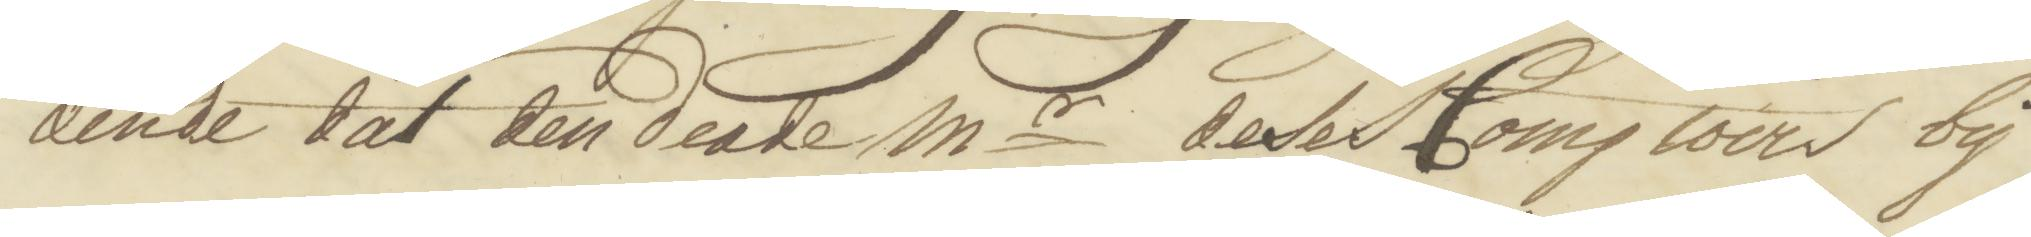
dende dat aen derde m=r deses Comptoirs bij
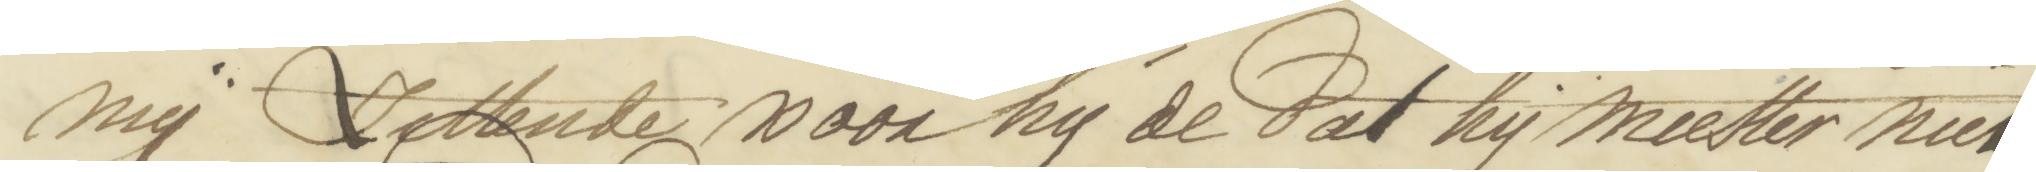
mij Zittende voor hy de dat hij meester niet
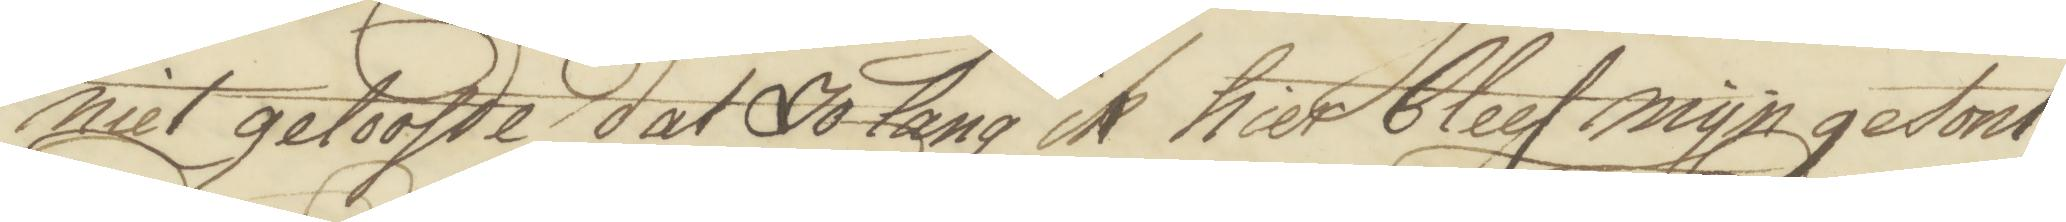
niet geloofde dat zo lang ik hier bleef mijn gesont
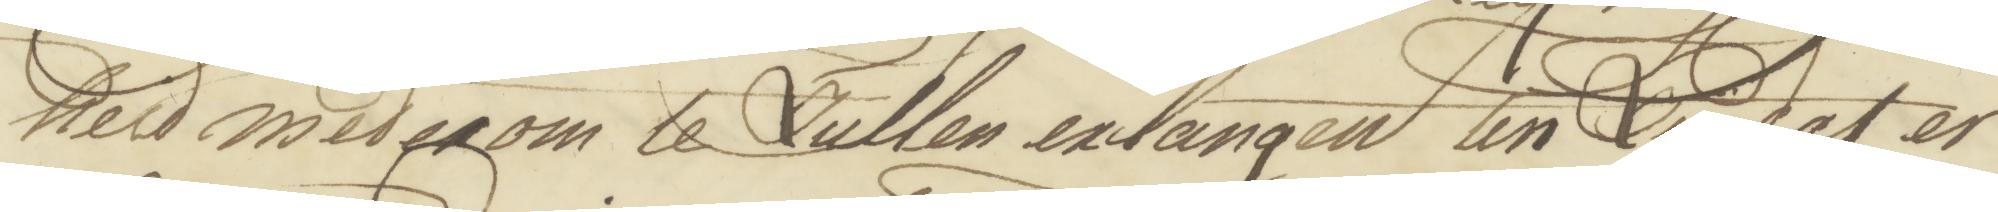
heid wederom te zullen erlangen ten zij dat er
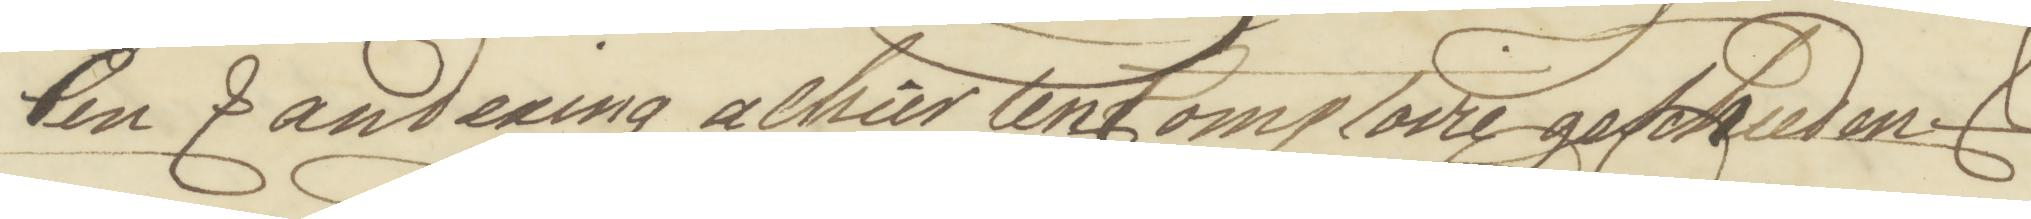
Een verandering alhier ten Comptoire geschieden ver
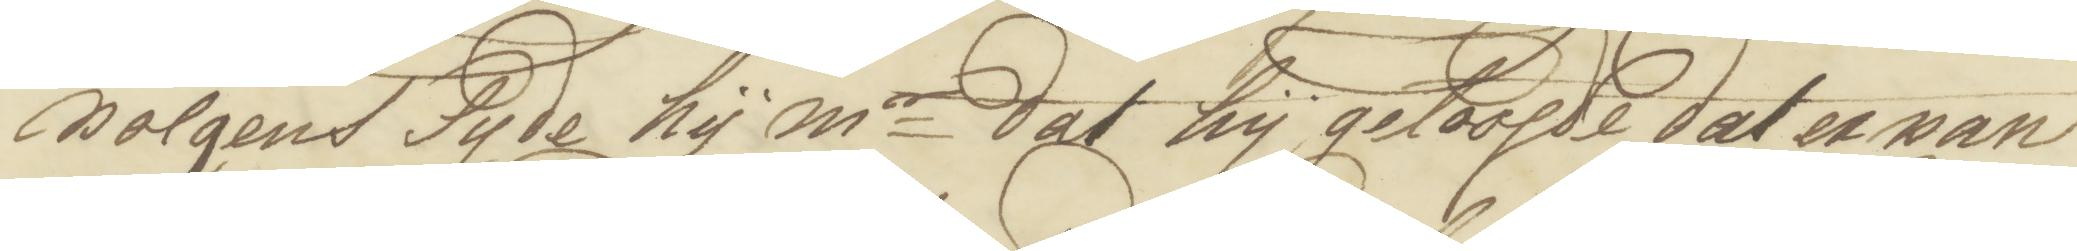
volgens syde hij m=r dat hij geloofde dat er van
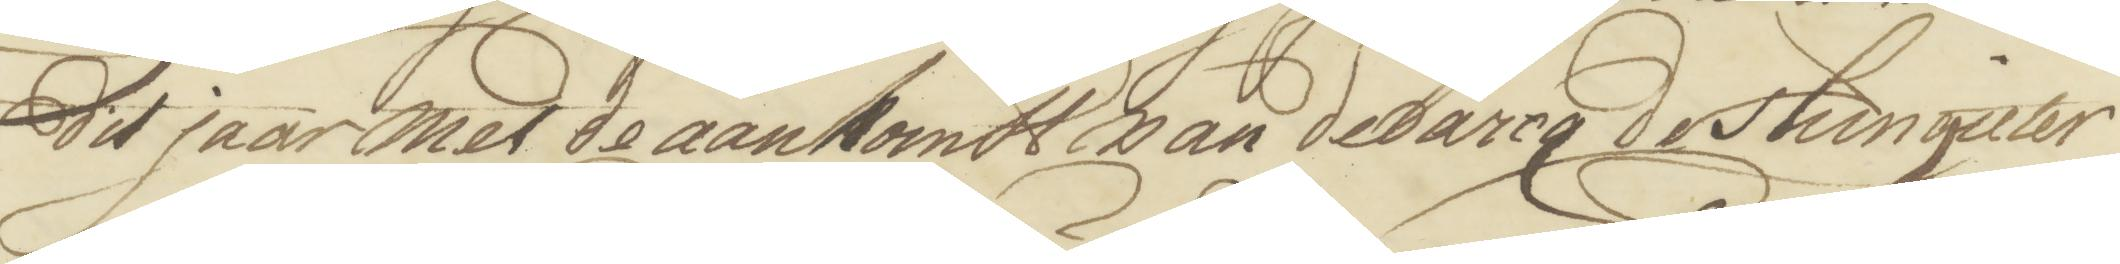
dit jaar met de aankomst van de barcq de shingieter
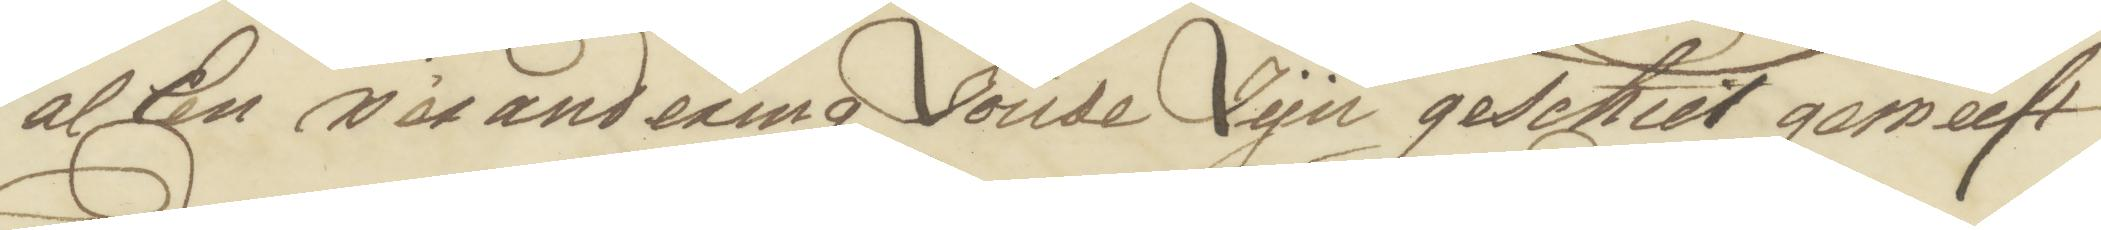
al Een verandering zoude zijn geschiet geweest
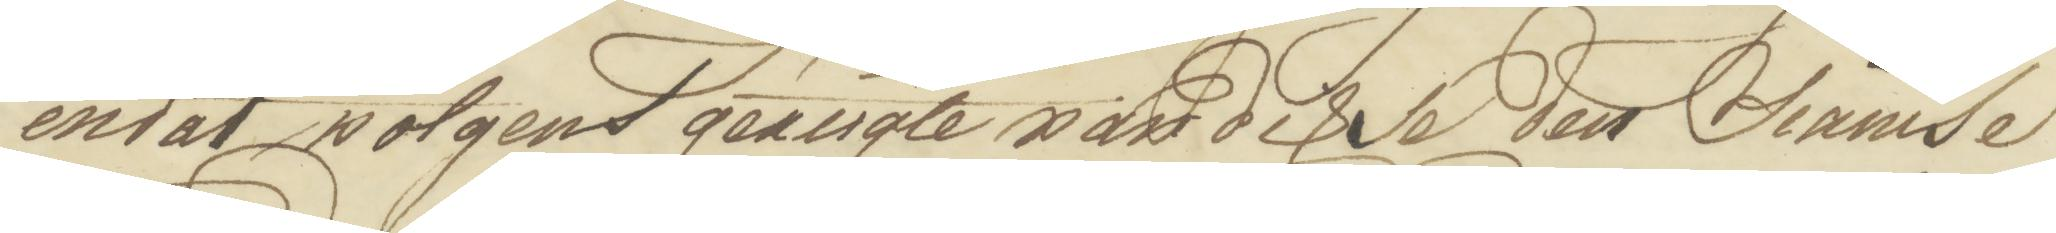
en dat volgens gerugte van diverse den Siamse
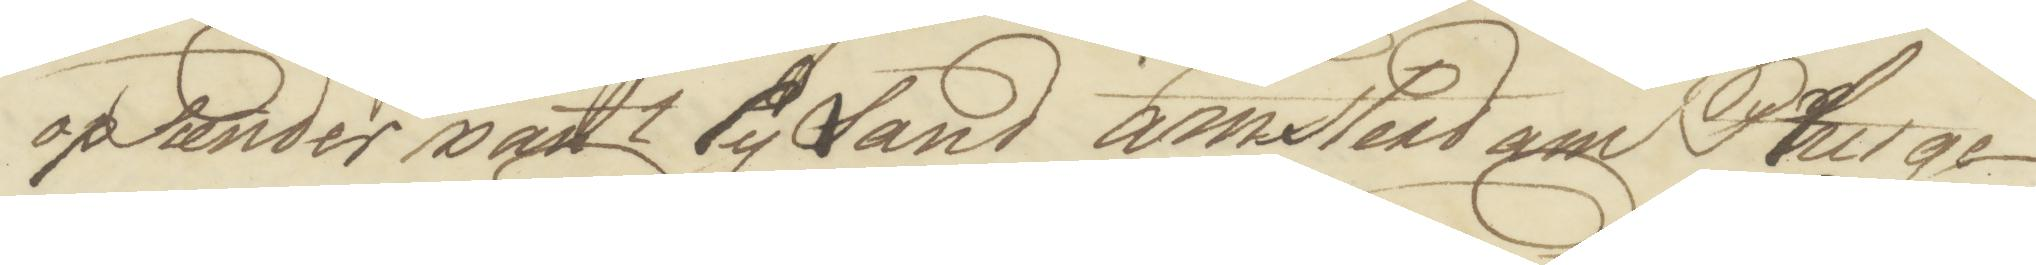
opsiender van't Eyland amsterdam Plutge
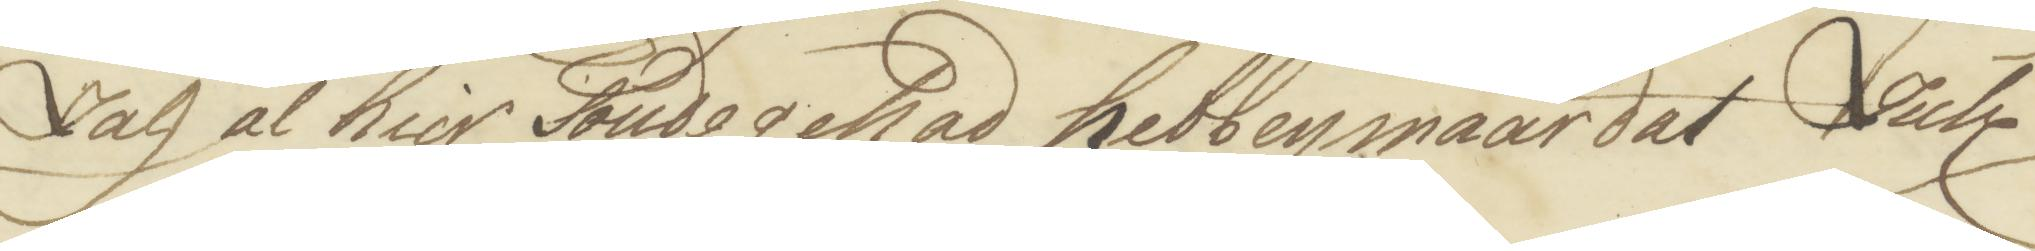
zag al hier soude gehad hebben maar dat zulx
